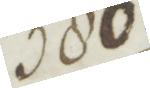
386
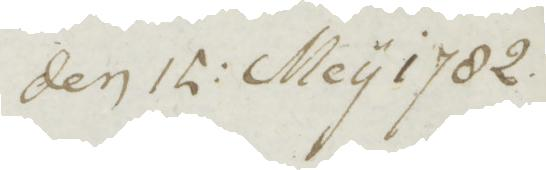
den 15: Meij 1782.
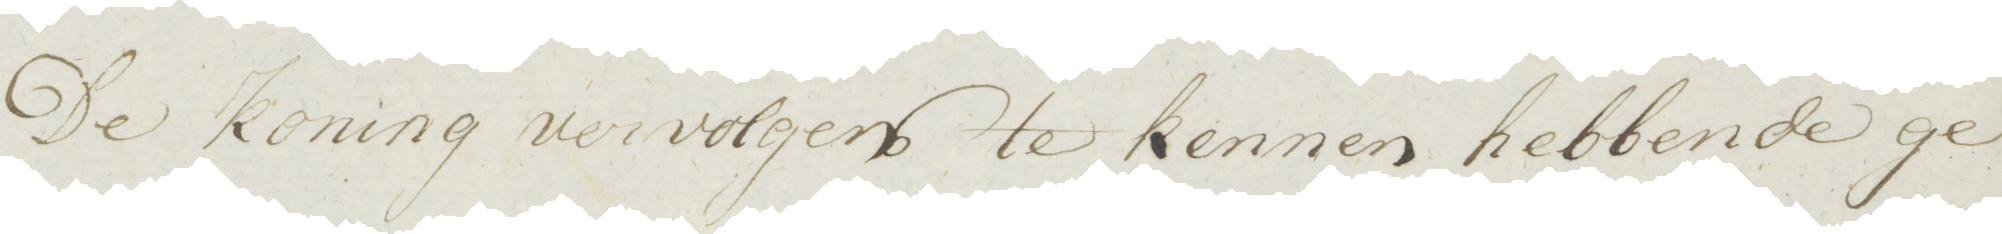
De koning vervolgens te kennen hebbende ge
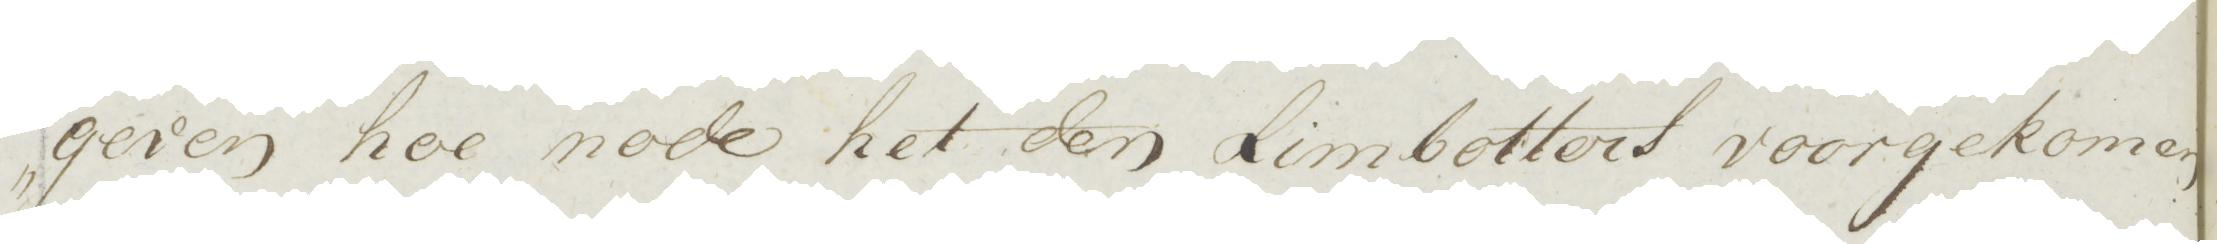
„geven hoe node het den Limbotters voorgekomen
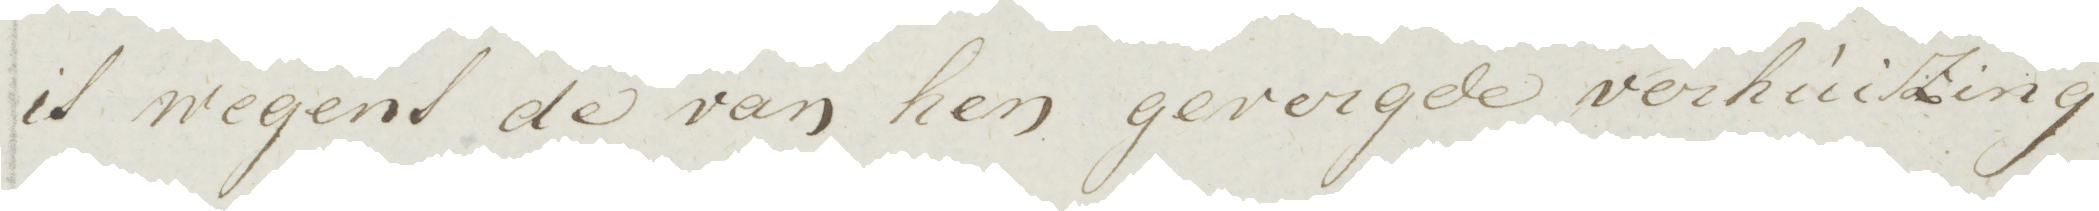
is wegens de van hen gevergde verhuizing
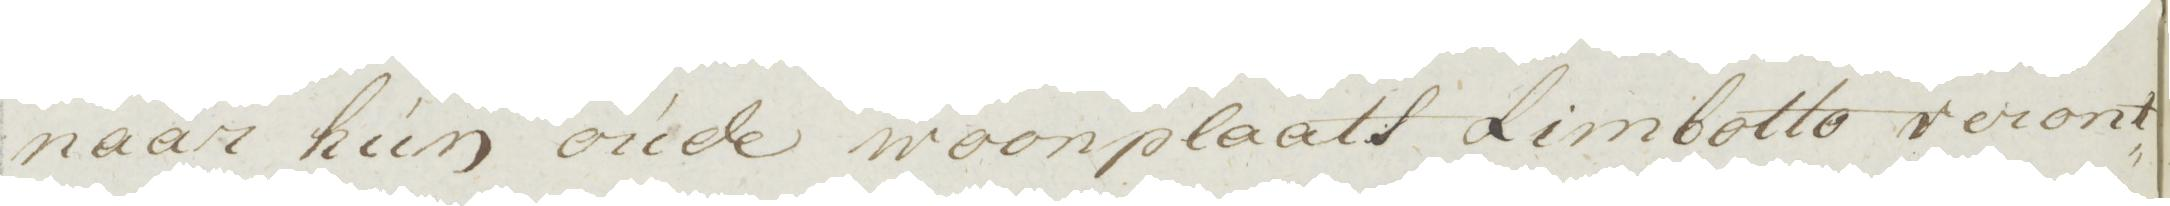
naar hun oude woonplaats Limbotto veront„
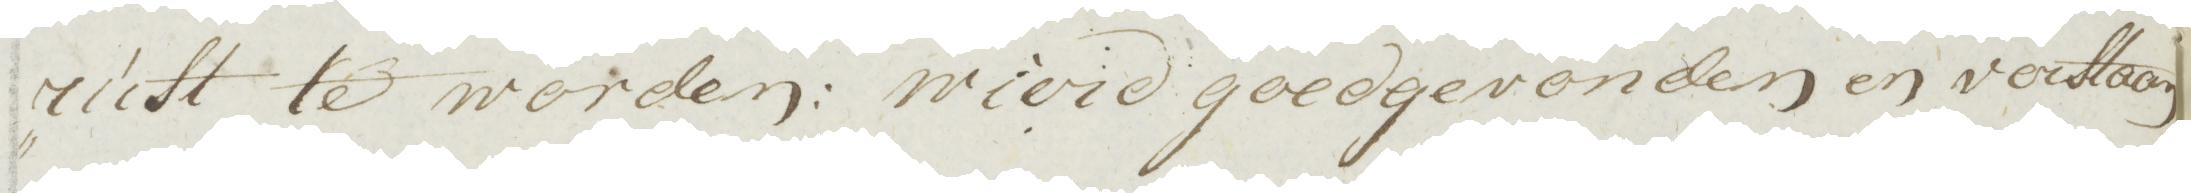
„rust te worden: wierd goedgevonden en verstaan
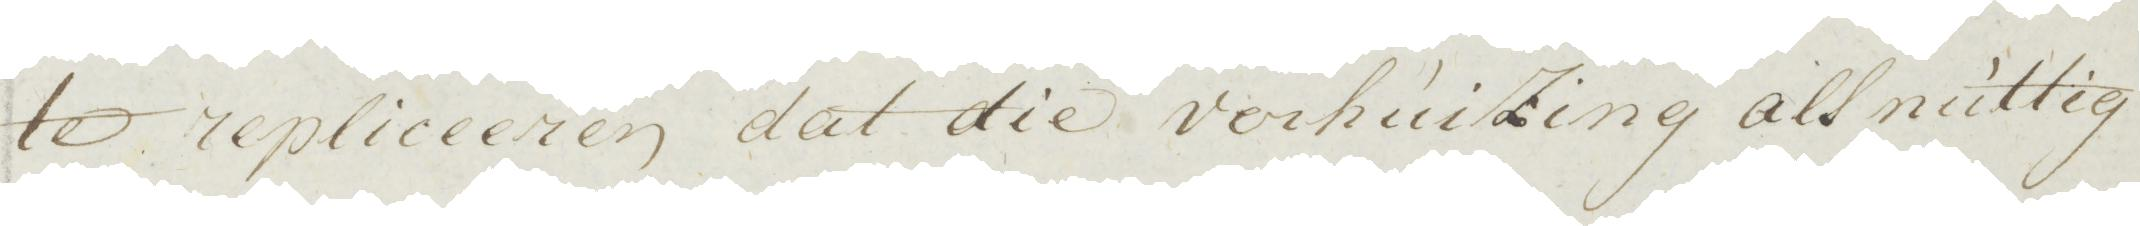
te repliceeren dat die verhuizing als nuttig
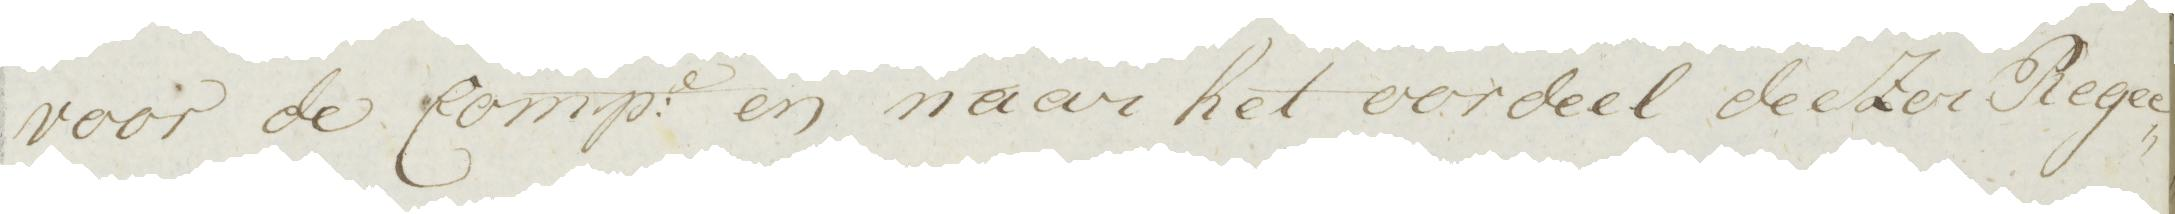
voor de Comp:e en naar het oordeel deezer Regee„
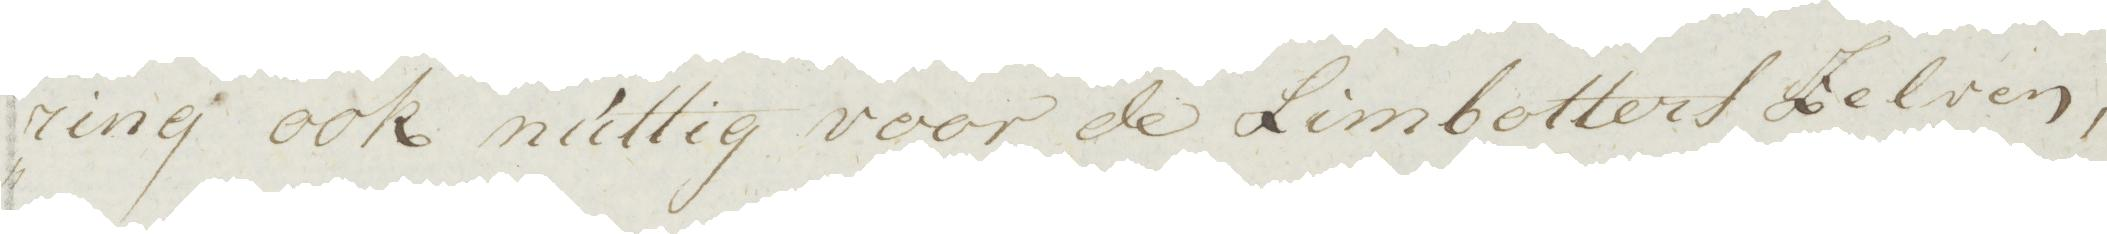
„ring ook nuttig voor de Limbotters zelven
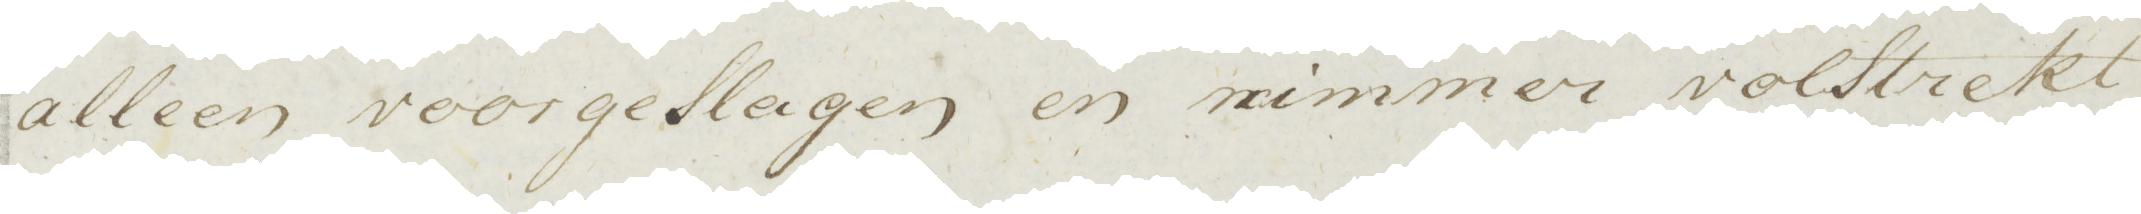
alleen voorgeslagen en nimmer volstrekt
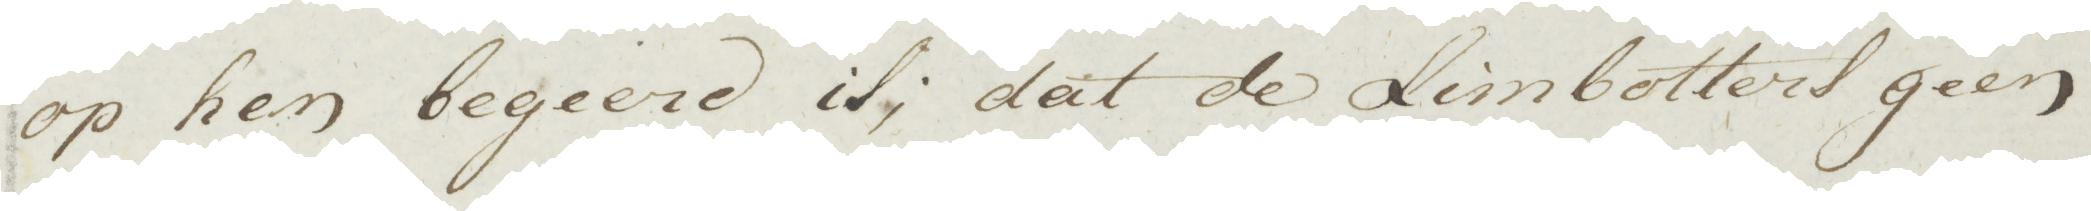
op hen begeerd is; dat de Limbotters geen
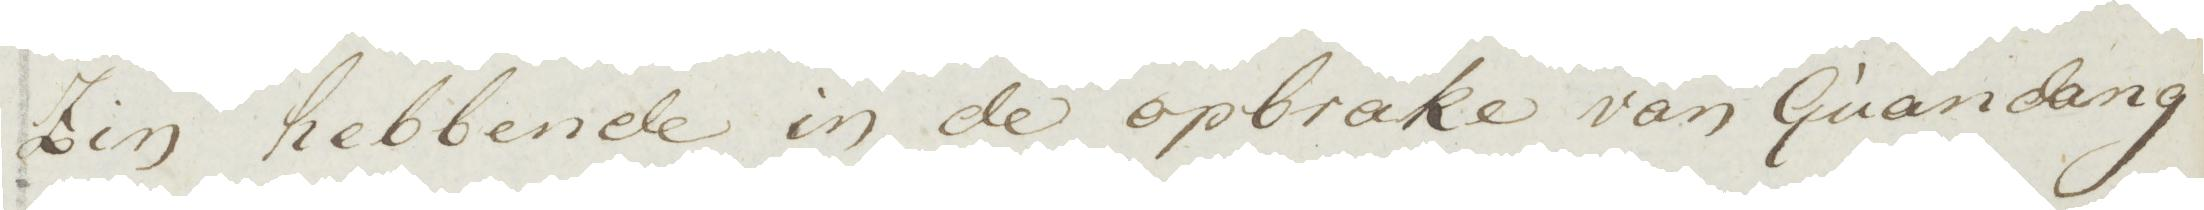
zin hebbende in de opbrake van Quandang
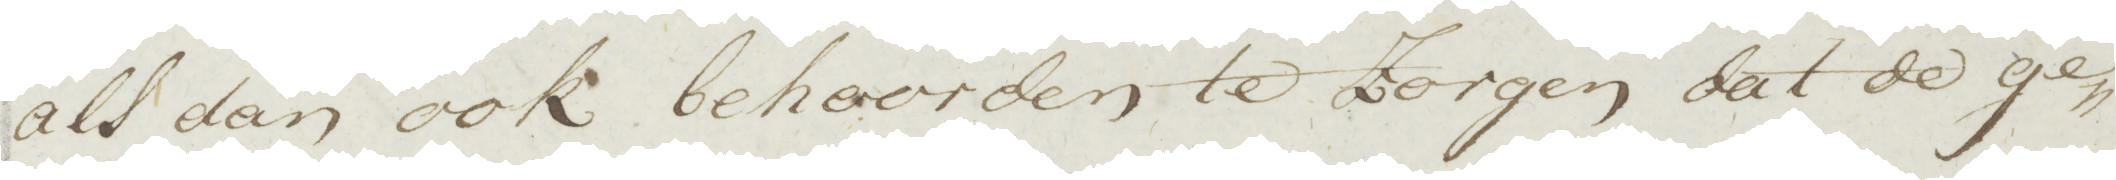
als dan ook behoorden te zorgen dat de ge„
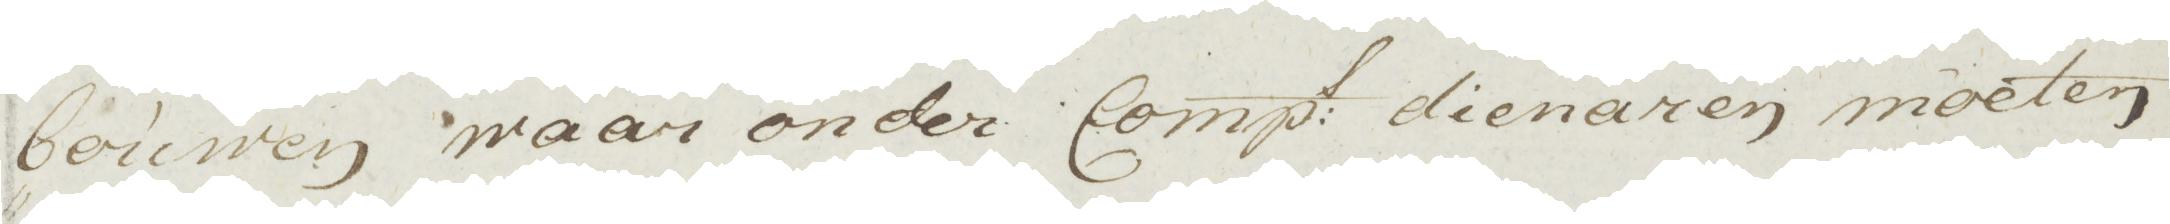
„bouwen waar onder Comp:s dienaren moeten
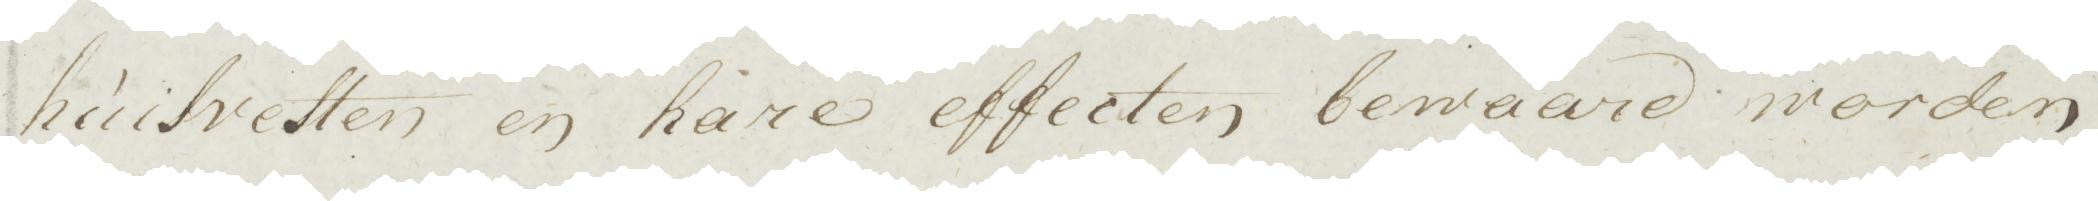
huisvesten en hare effecten bewaard worden
